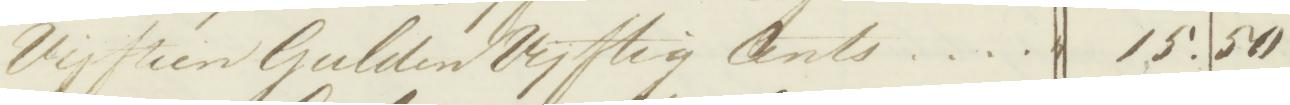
Vijftien Gulden Vijftig Cents . . . . „ 15.50
